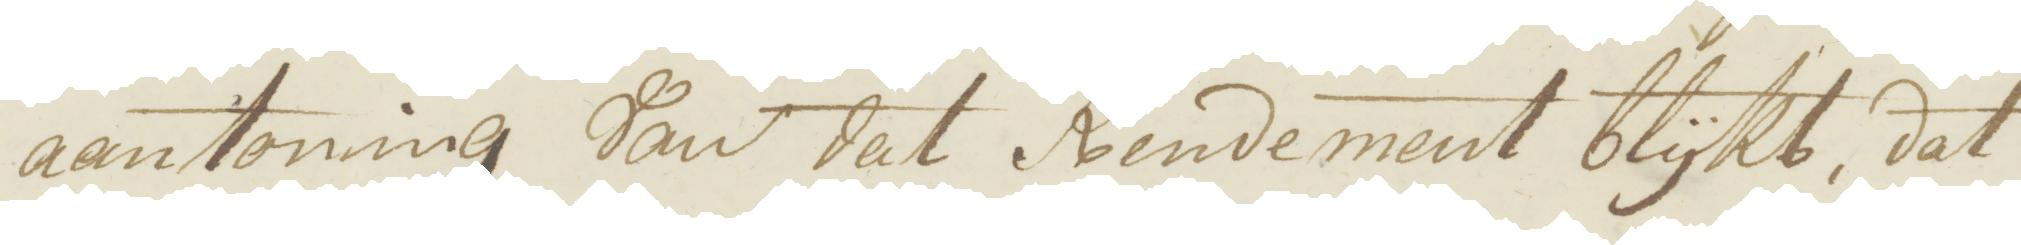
aantoning van dat Rendement blijkt, dat
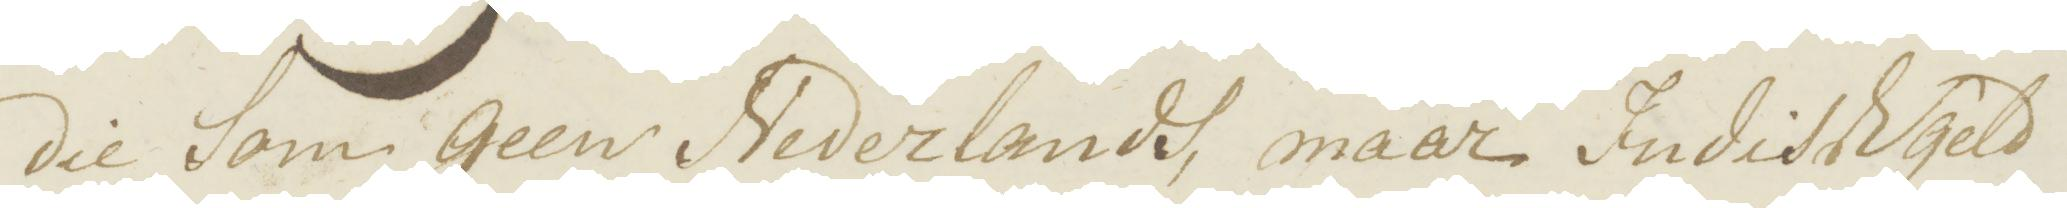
die som geen Nederlands, maar Indisch geld
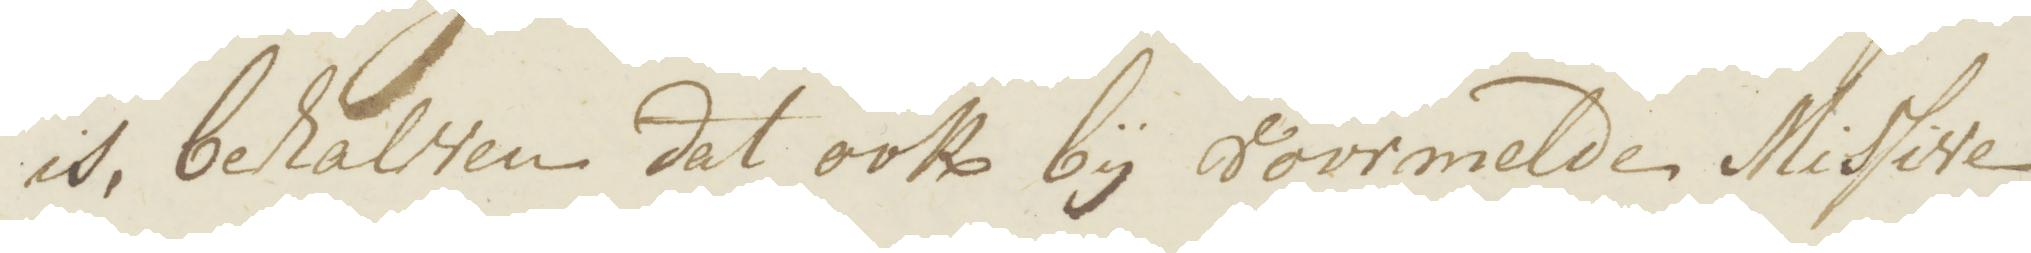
is, behalven dat ook bij voormelde Missive
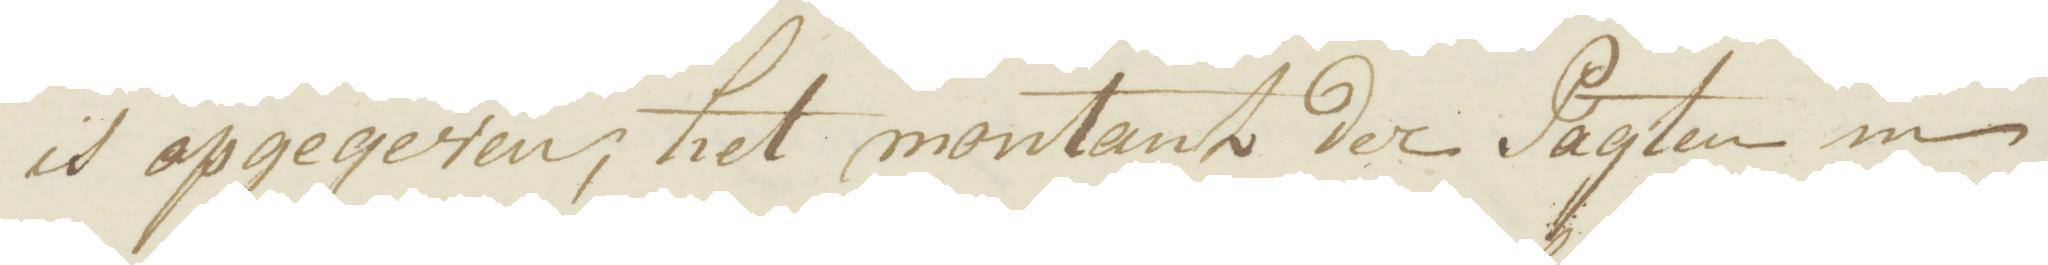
is opgegeven, het montant der Pagten in
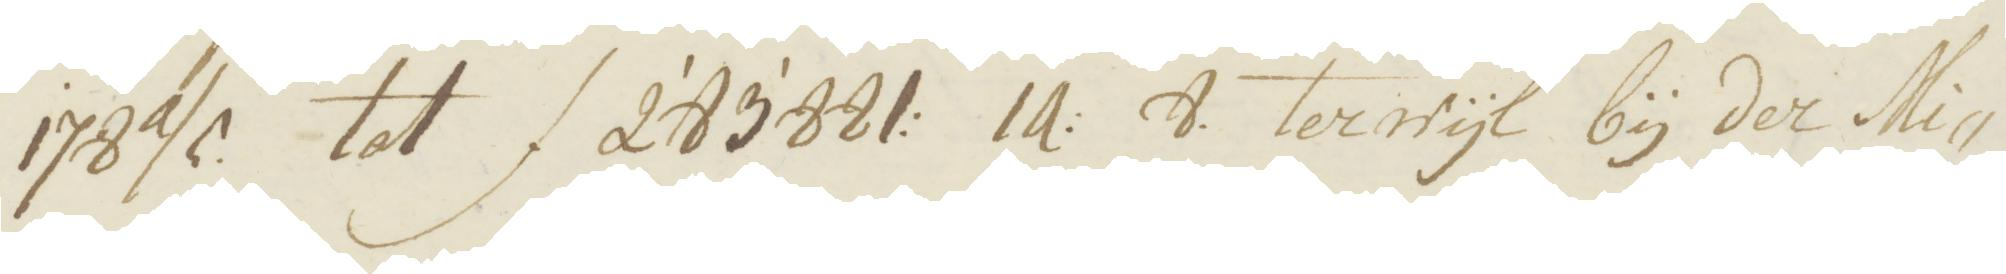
178 4/5. tot ƒ 2'83'881: 14: 8. terwijl bij der Mi„
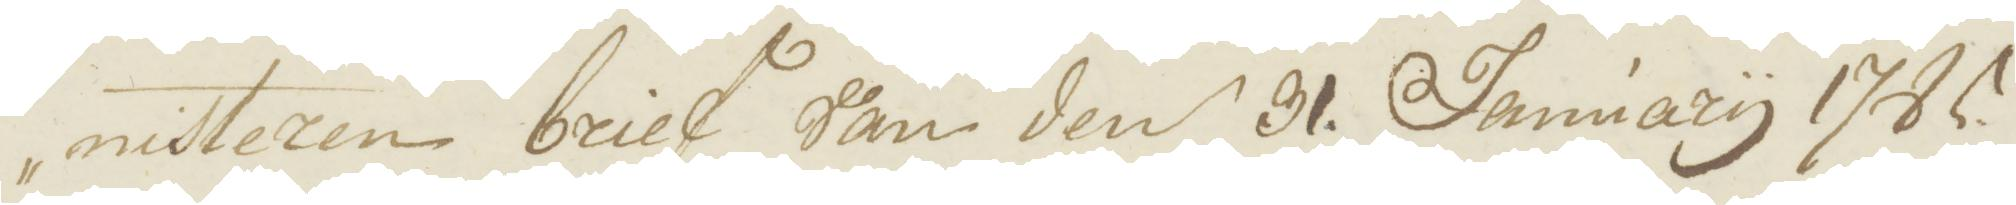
„ nisteren brief van den 31. Januarij 1785.
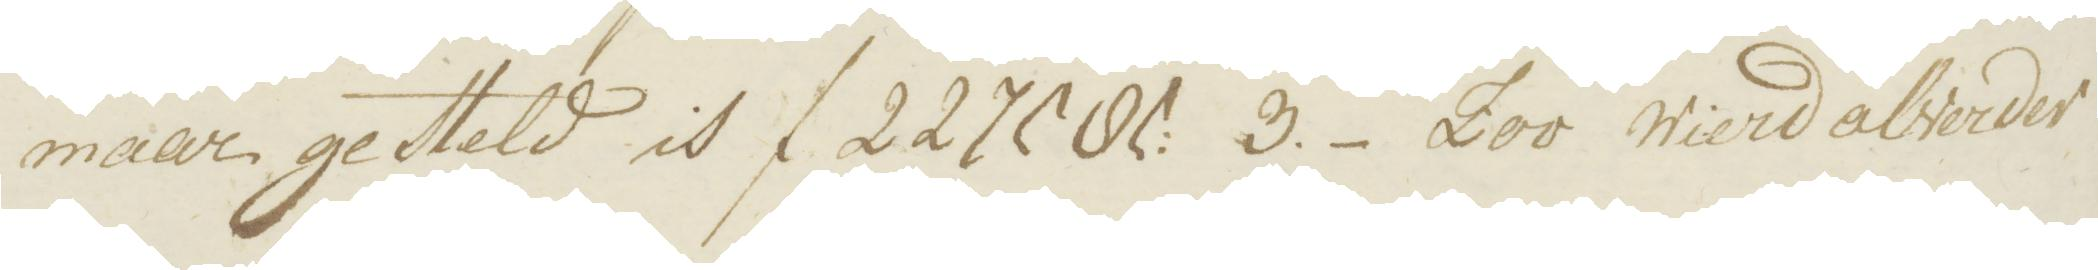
maar gesteld is ƒ 227585: 3. – zoo wierd alverder
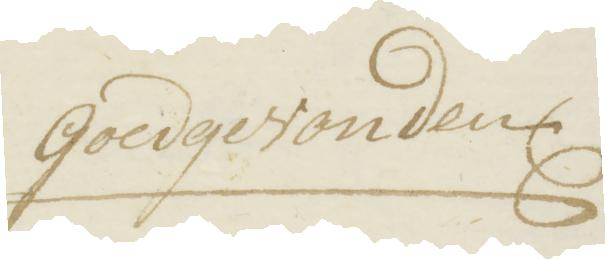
goedgevonden
